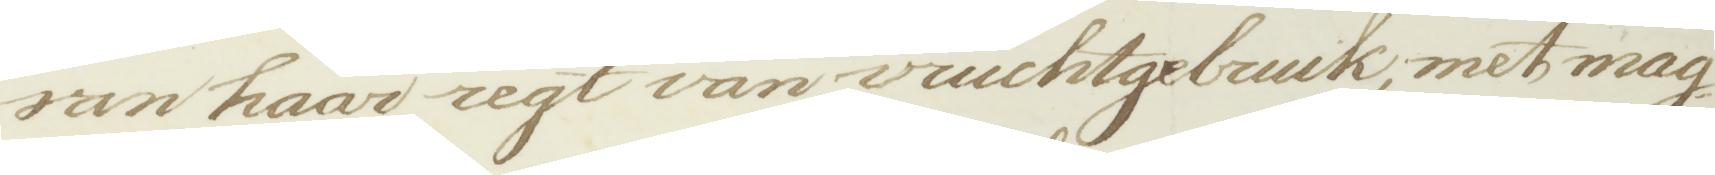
van haar regt van vruchtgebruik, met mag
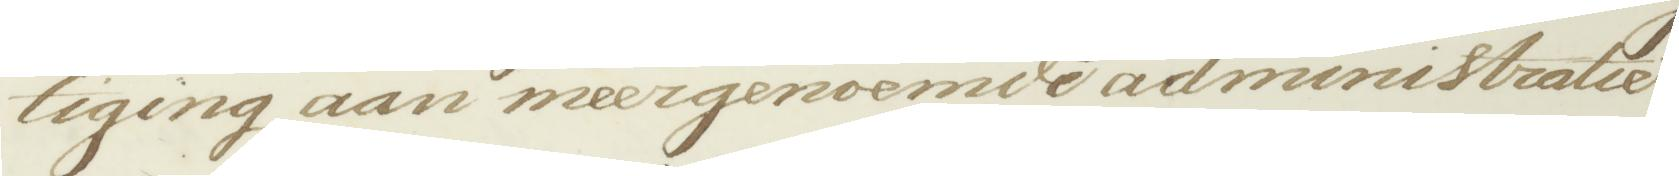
tiging aan meergenoemde administratie
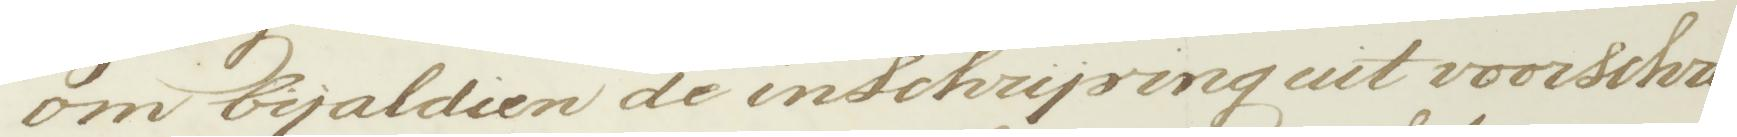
om bij aldien de inschrijving uit voorschre
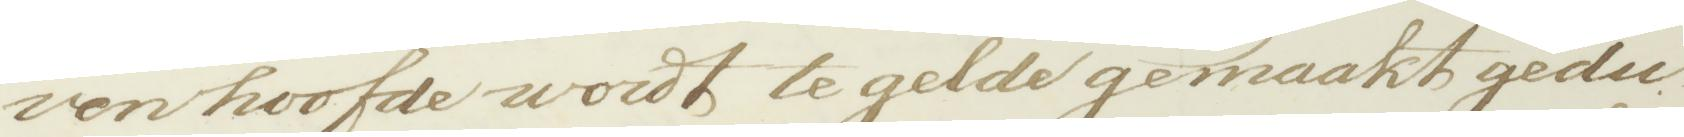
ven hoofde wordt te gelde gemaakt gedu.
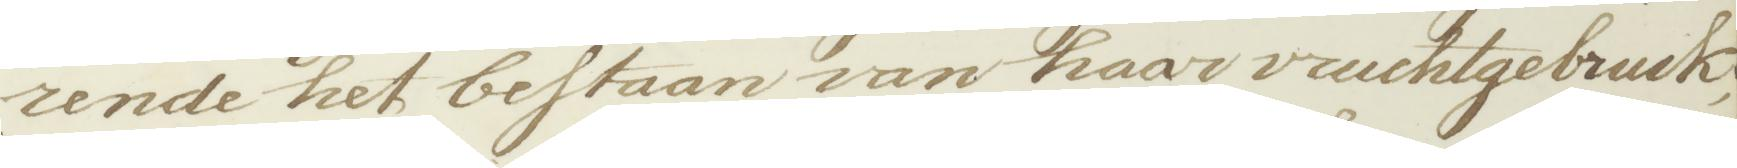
rende het bestaan van haar vruchtgebruik
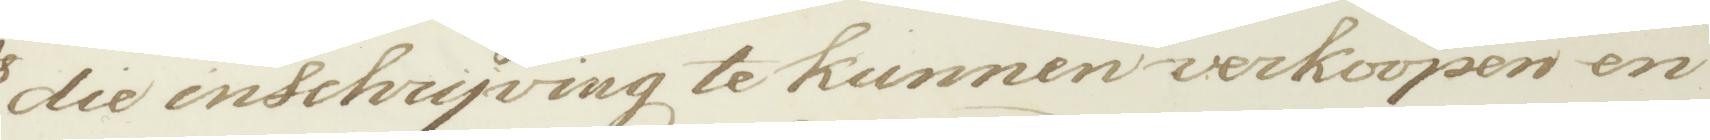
die inschrijving te kunnen verkoopen en
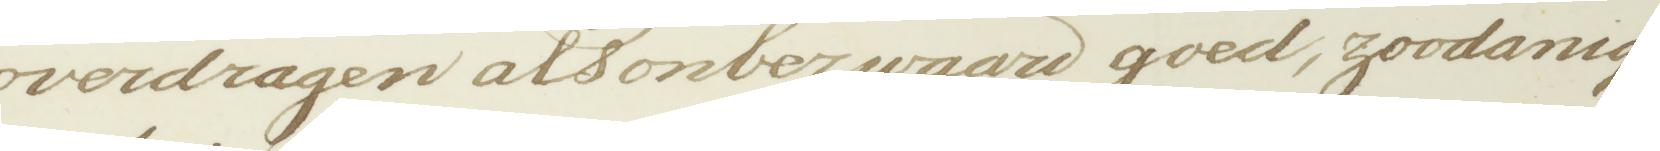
overdragen als onbezwaard goed, zoodanig
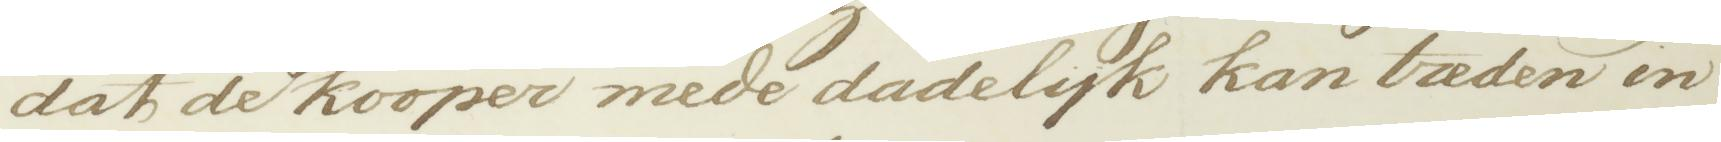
dat de kooper mede dadelijk kan treden in
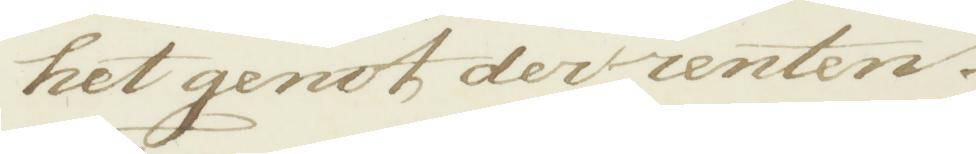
het genot der renten
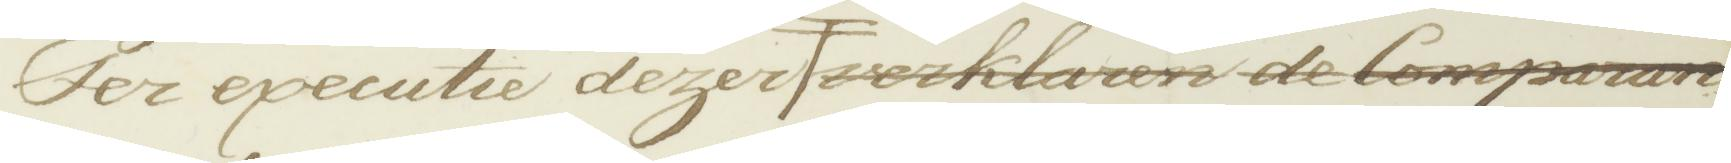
Ter executie dezer ¶ verklaren de Comparan
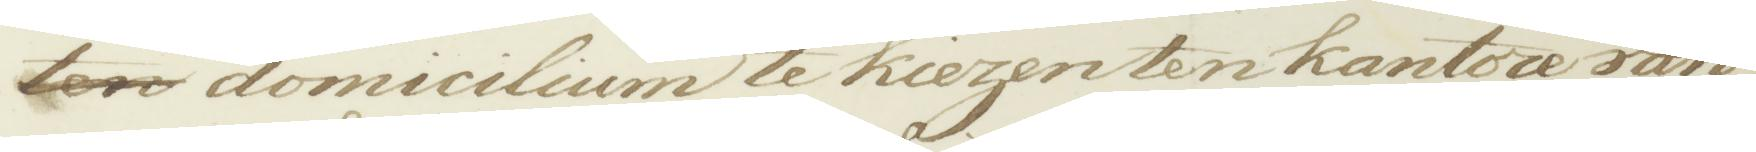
ten domicilium te kiezen ten kantore van
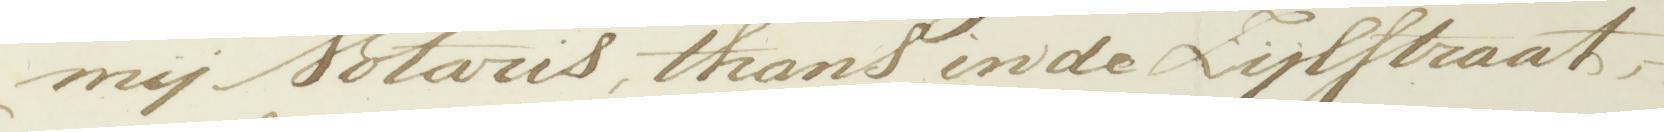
mij Notaris, thans in de Zijlstraat,
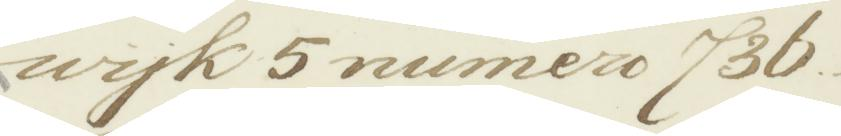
wijk 5 numero 736.
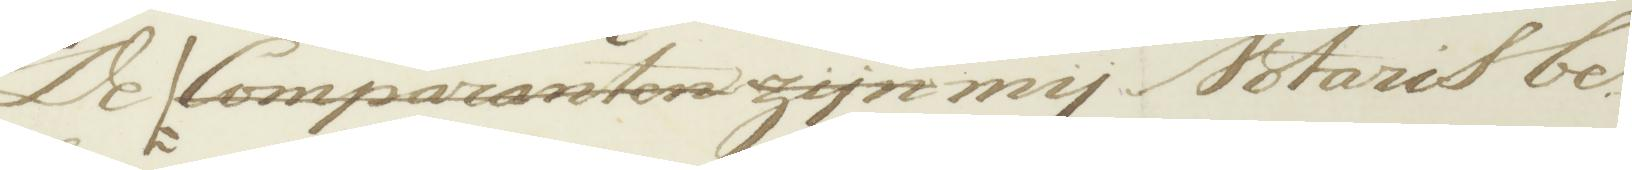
De Comparanten zijn mij Notaris be,
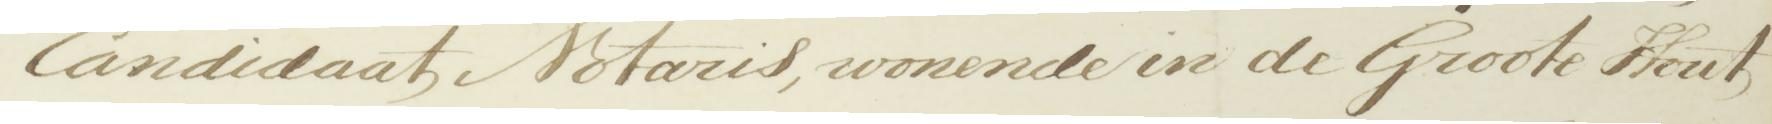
Candidaat Notaris, wonende in de Groote Hout
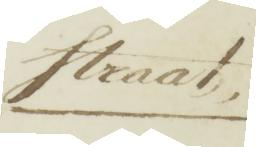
Straat,
